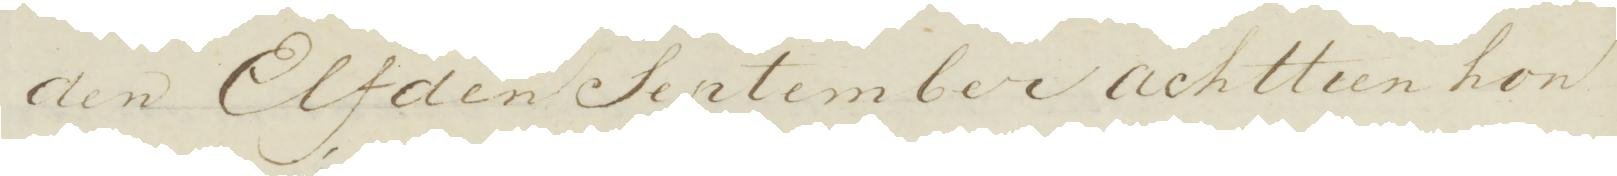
den Elfden September achttien hon
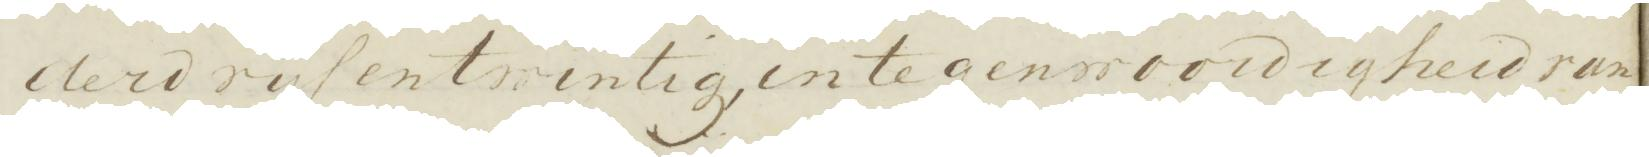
derd vijf en twintig, in tegenwoordigheid van
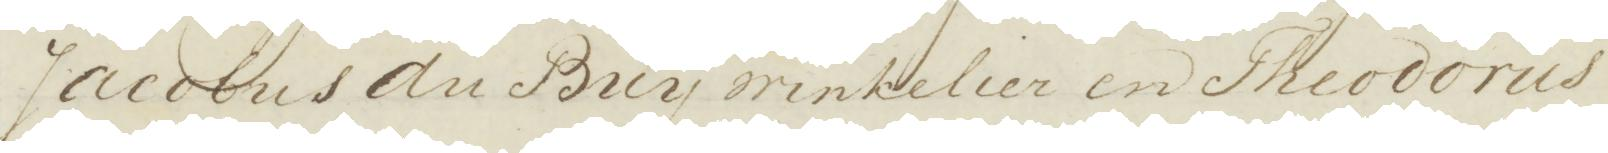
Jacobus du Buij winkelier en Theodorus
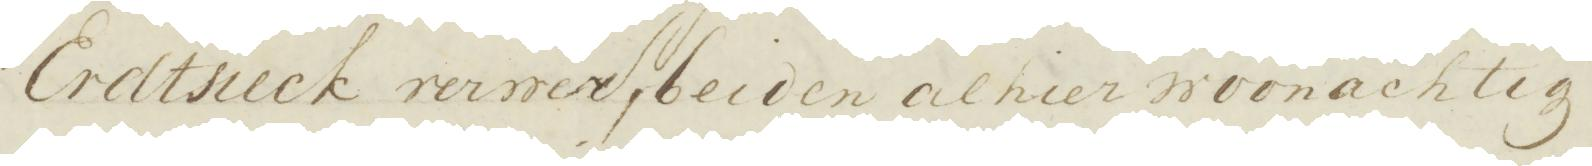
Erdtsieck verwer, beiden alhier woonachtig
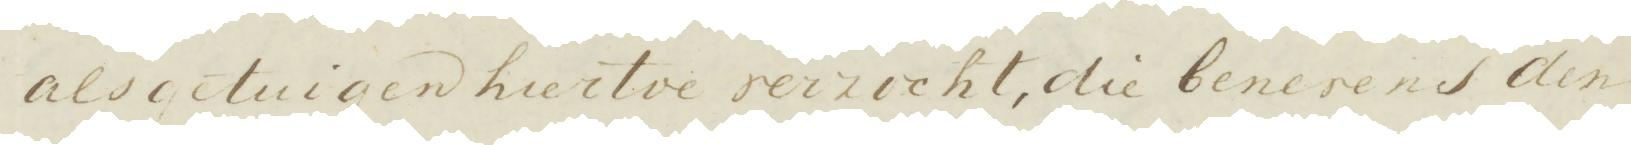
als getuigen hiertoe verzocht, die benevens den
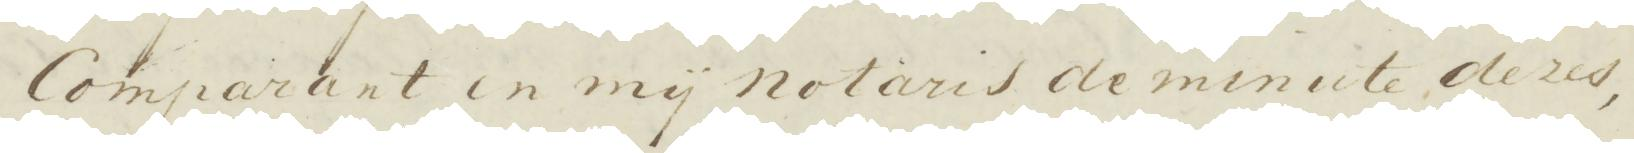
Comparant en mij notaris de minute dezes,
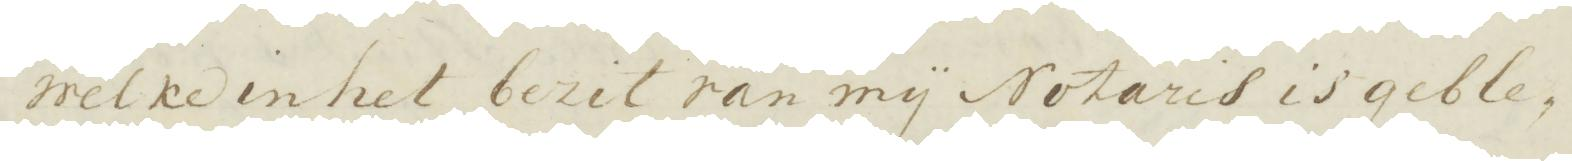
welke in het bezit van mij Notaris is geble„
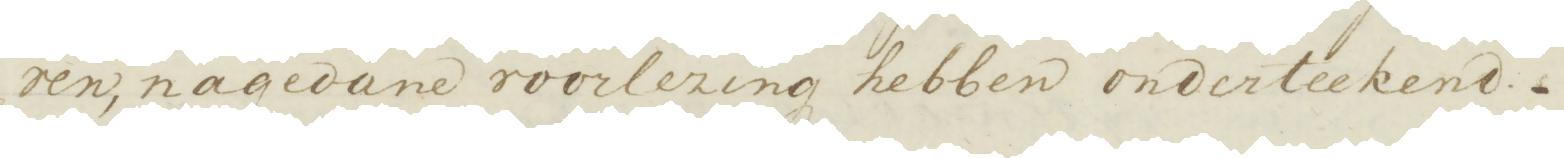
=ven, nagedane voorlezing hebben onderteekend.
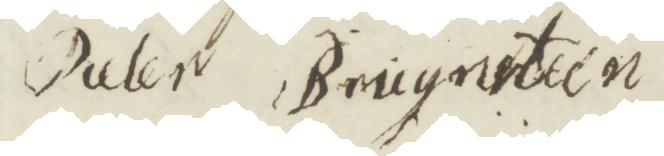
Pieter Bruynsteen
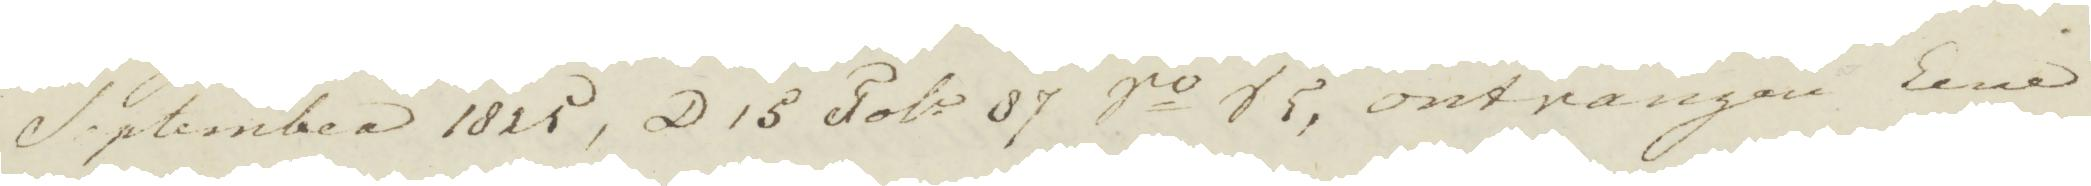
September 1825, D 15 Fol.o 87 V=o V5, ontvangen Eene
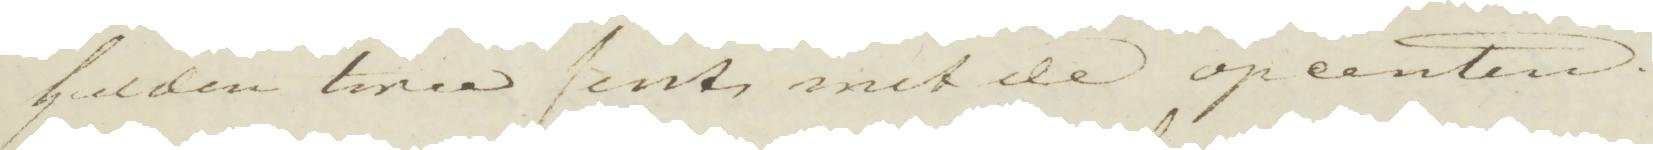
Gulden twee Cents met de opcenten.
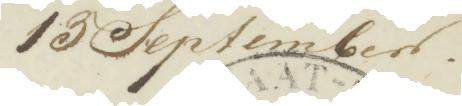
13 September.
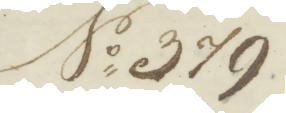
N„o 379
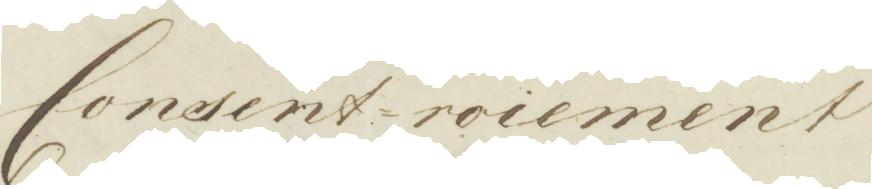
Consent=roiement
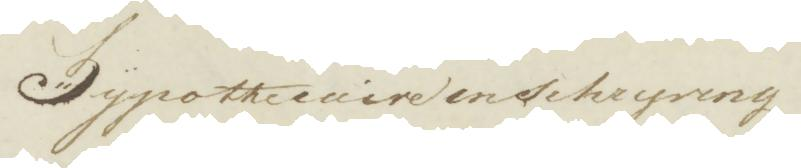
Hijpothecaire inschryving
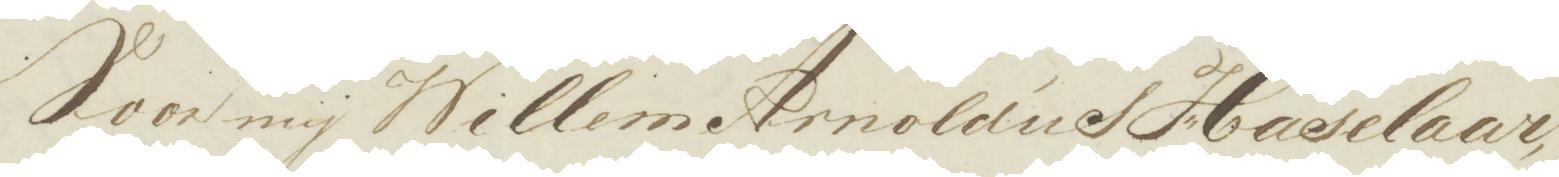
Voor mij Willem Arnoldus Haselaar,
